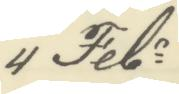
4 Feb=r
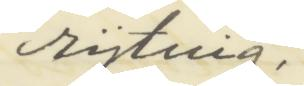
Rijtuig,
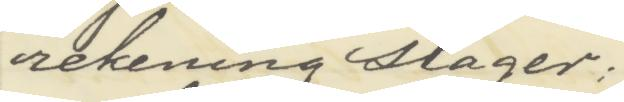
rekening slager;
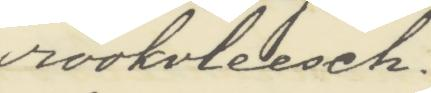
rookvleesch.
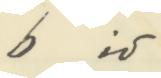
6 id
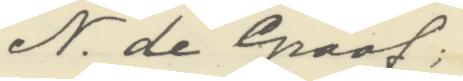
N. de Graaf;
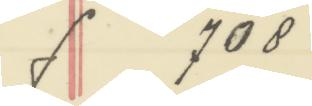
ƒ 708
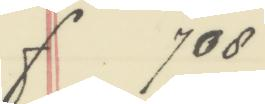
f 708
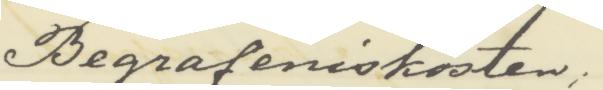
Begrafeniskosten;
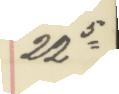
22=5
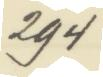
294
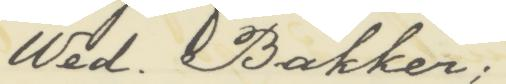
Wed. Bakker;
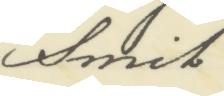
Smit
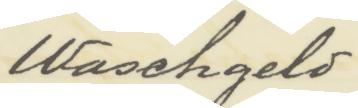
Waschgeld
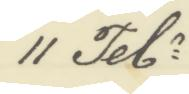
1 Feb:r
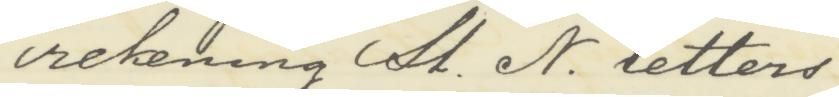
rekening M. N. letters
